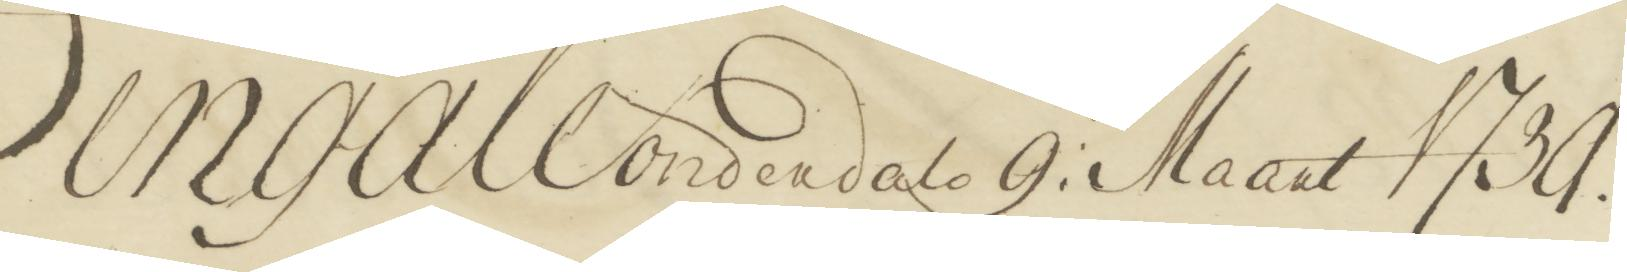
Van Bengale onderdato 9:' Maart 1734.
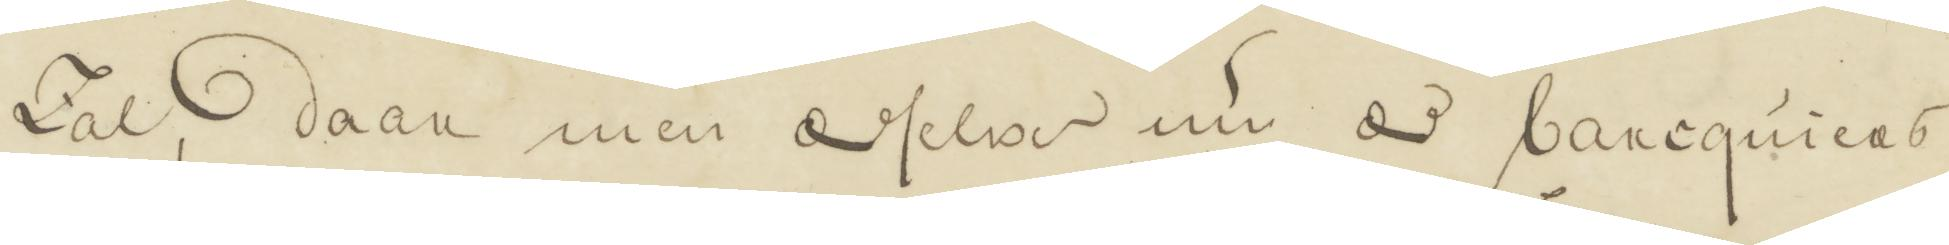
zal, daar men deselve nu de barcquiers
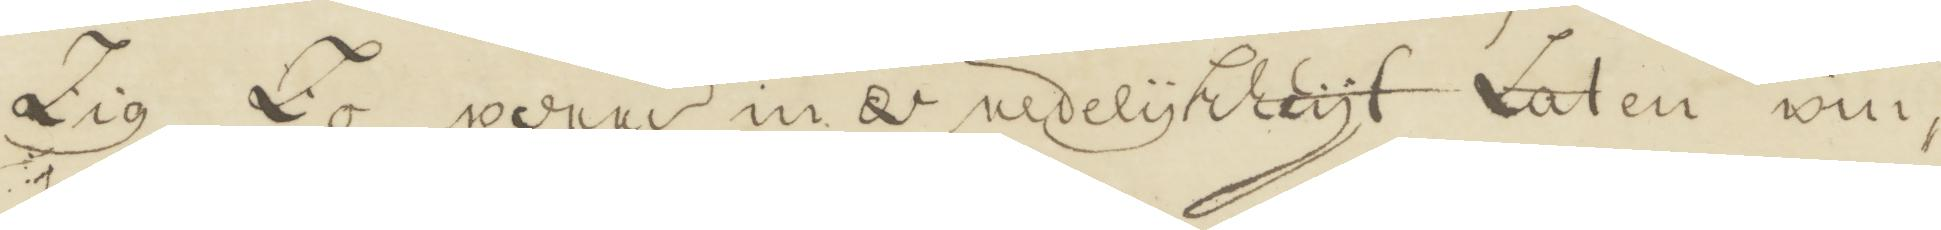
zig zo verre in de redelijkheijt laten vin„
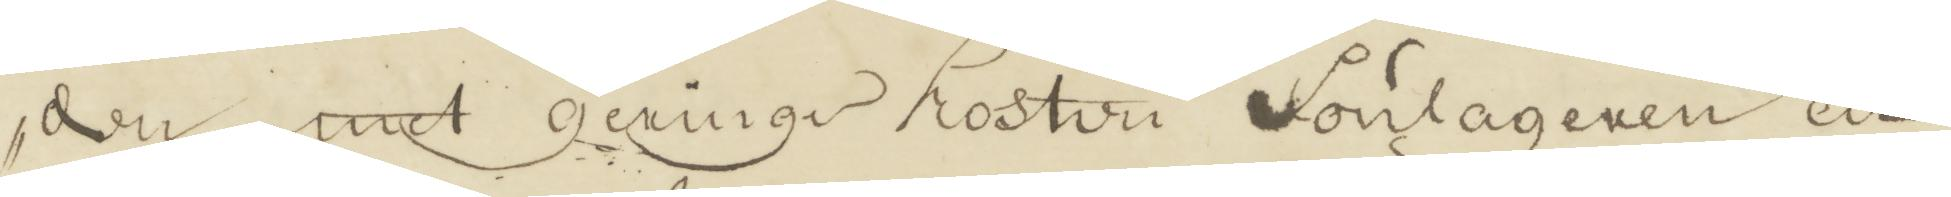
„den, met geringe kosten soulageren en
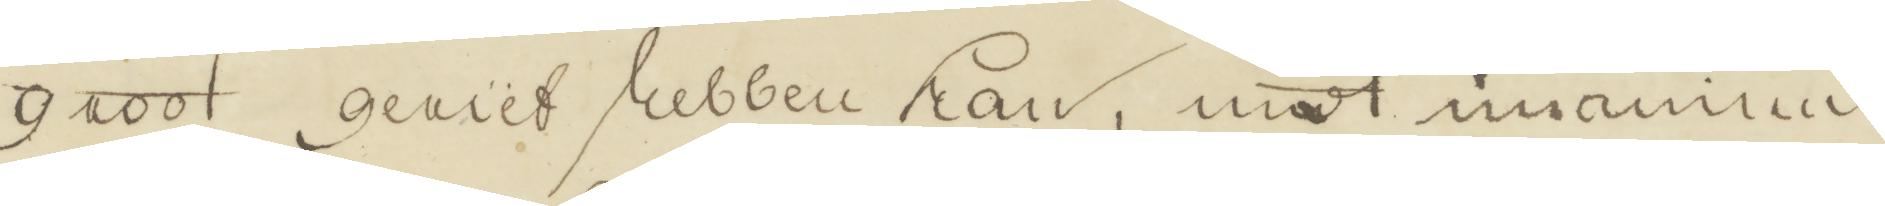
groot gerief hebben kan, met unanime
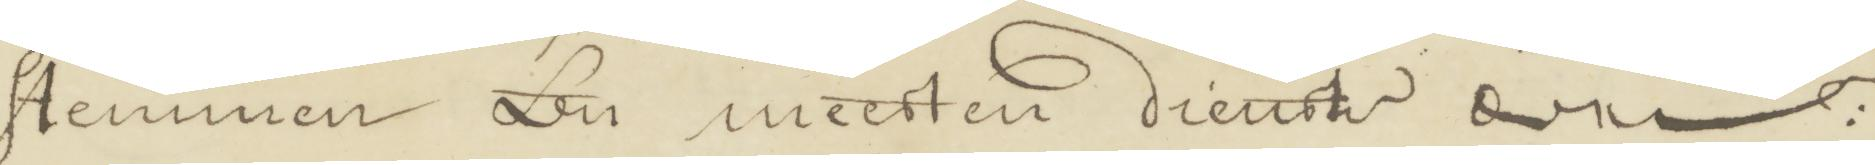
stemmen ten meesten dienste der E:
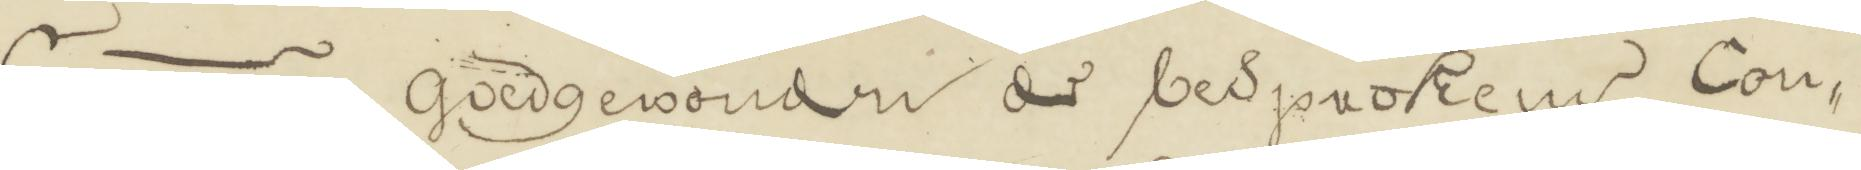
Comp: goedgevonden de besprokene Con„
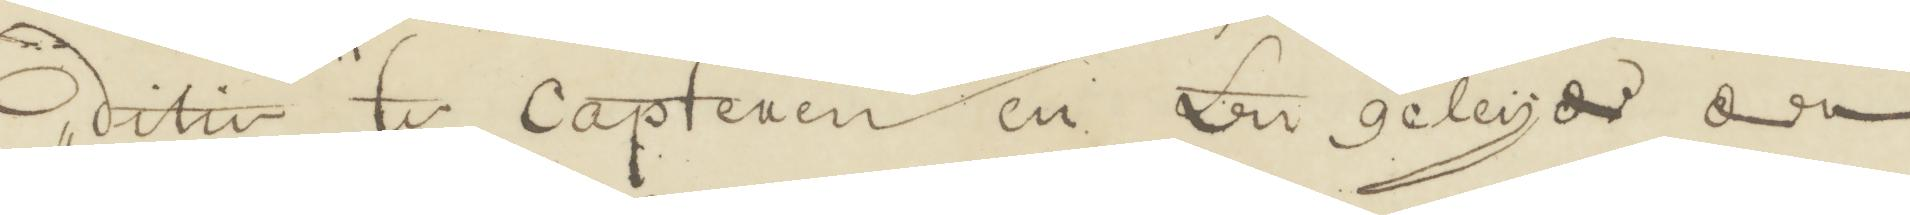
„ditie te capteren en ten geleijde der
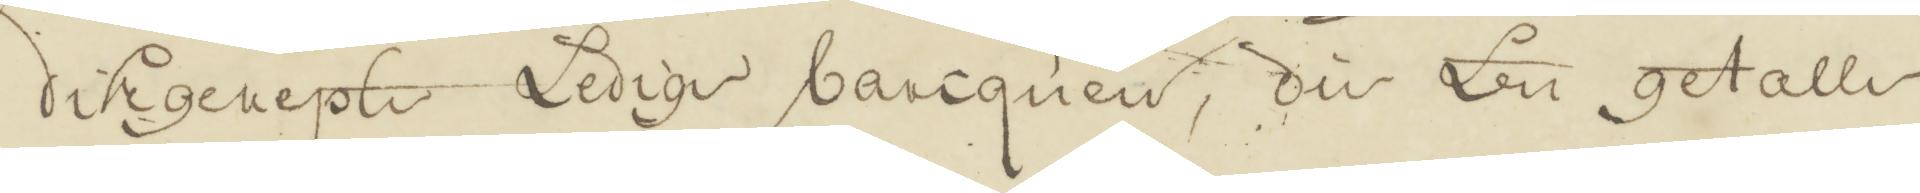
dikgerepte Ledige barcquen, die ten getalle
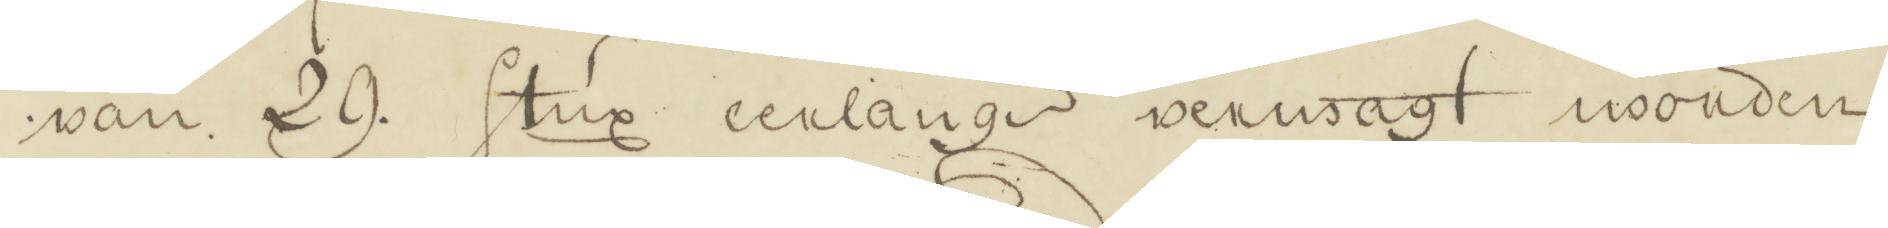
van. 29. stux: eerlange verwagt worden,
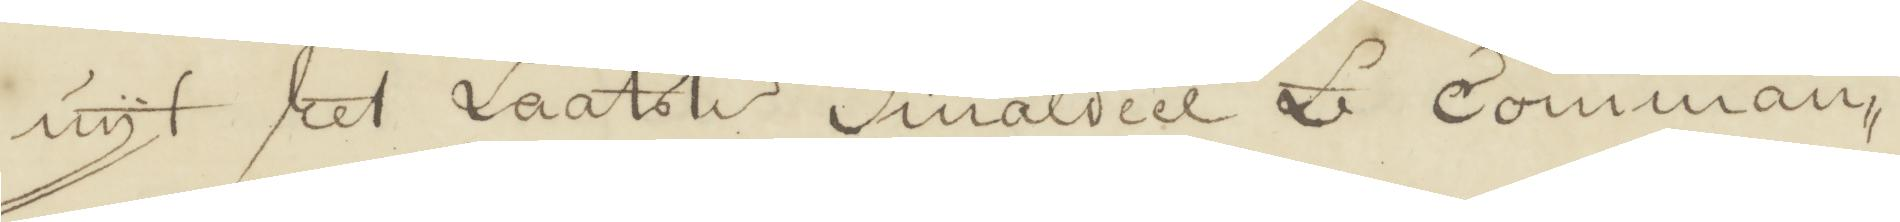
uijt het laatste smaldeel te Comman„
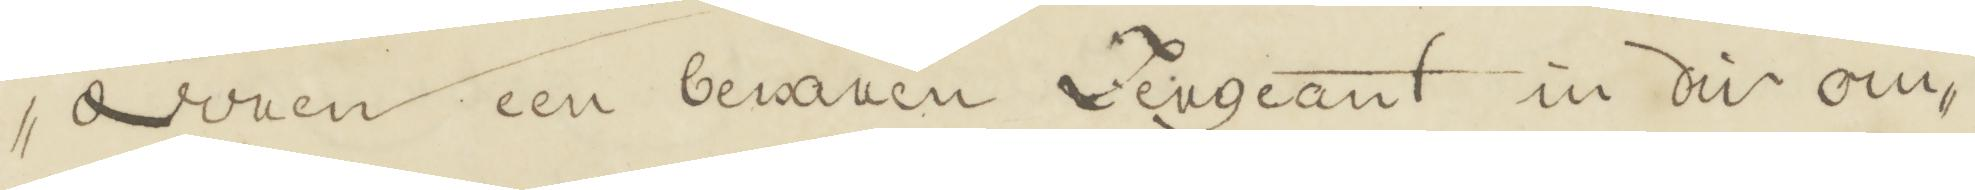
„deeren een bevaren Zergeant in die om„
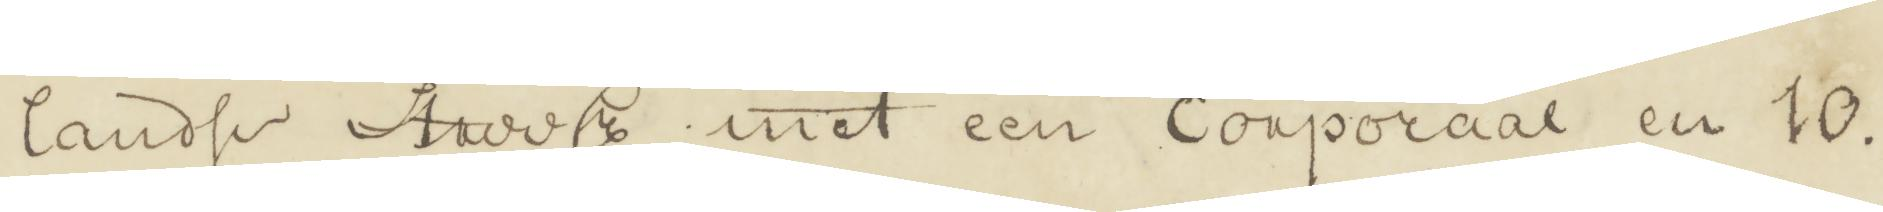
landse streek met een corporaal en 10.
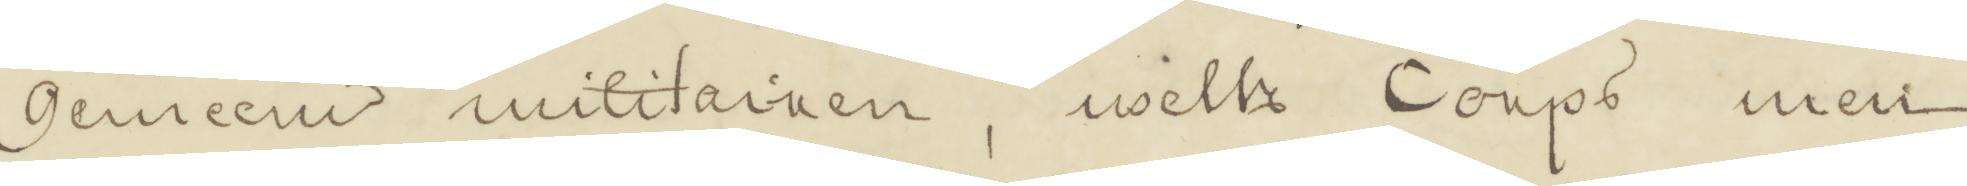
gemeene militairen, welk Corps men
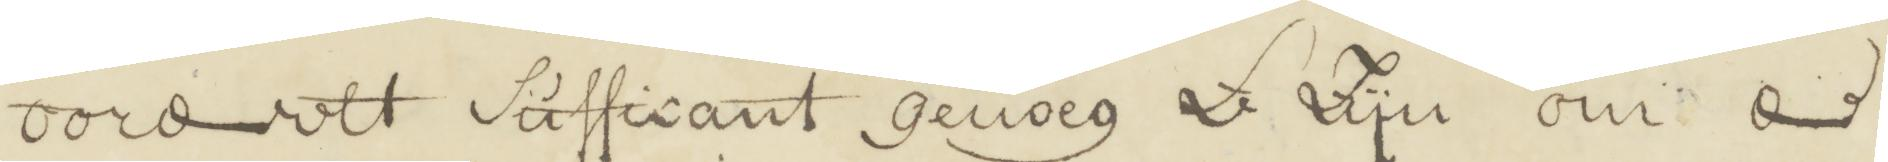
oordeelt sufficant genoeg te zijn om de
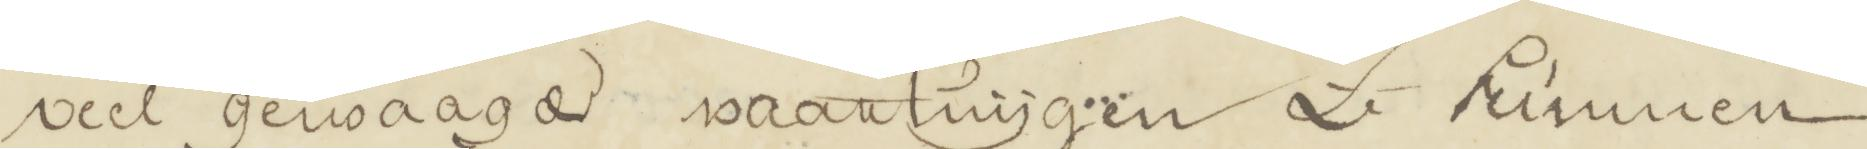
veel gewaagde vaartuijgen te kunnen
